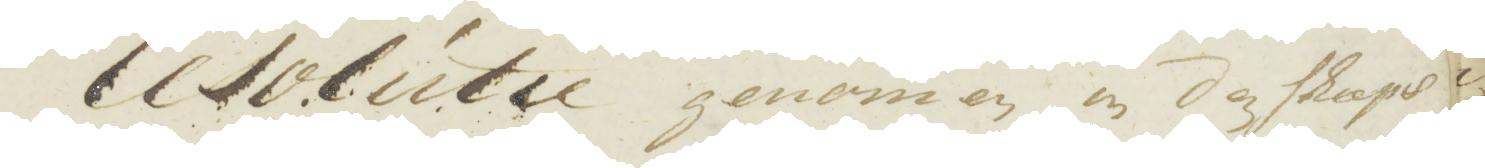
Resolutie genomen in den scheeps
